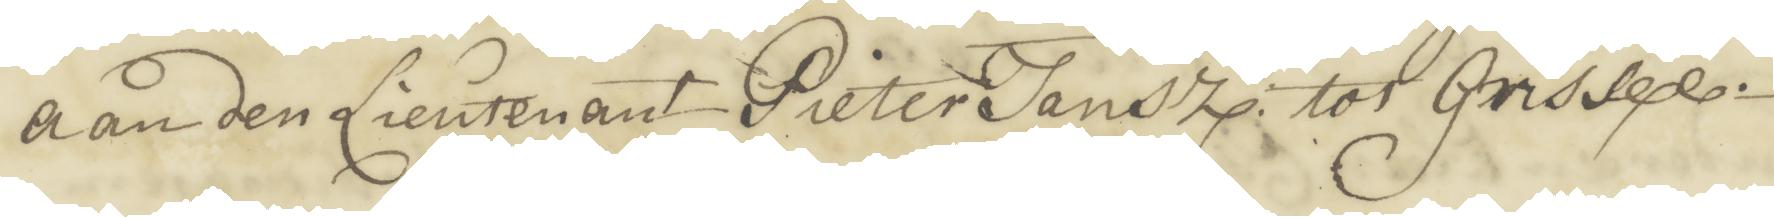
aan den Lieutenant Pieter Iansz: tot Grissee —.
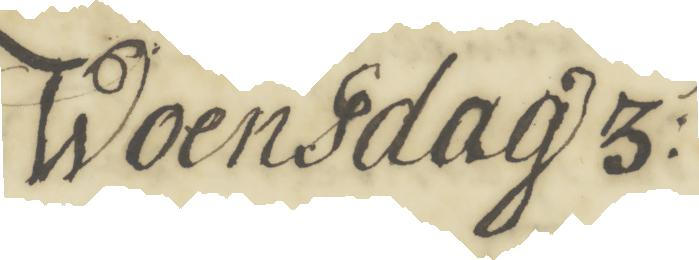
Woensdag 3:'
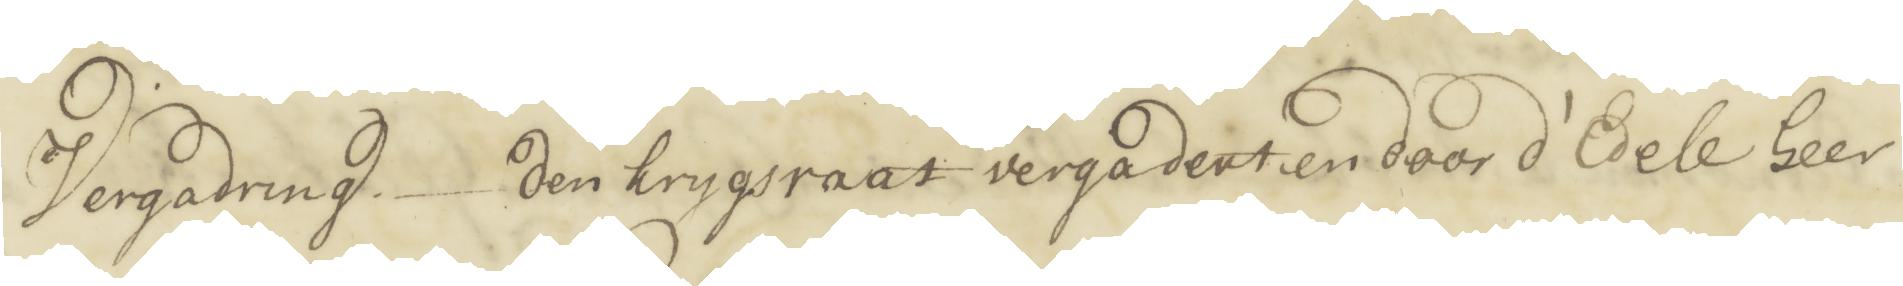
Vergadring. — den krygsraat vergadert en door d’Edele heer
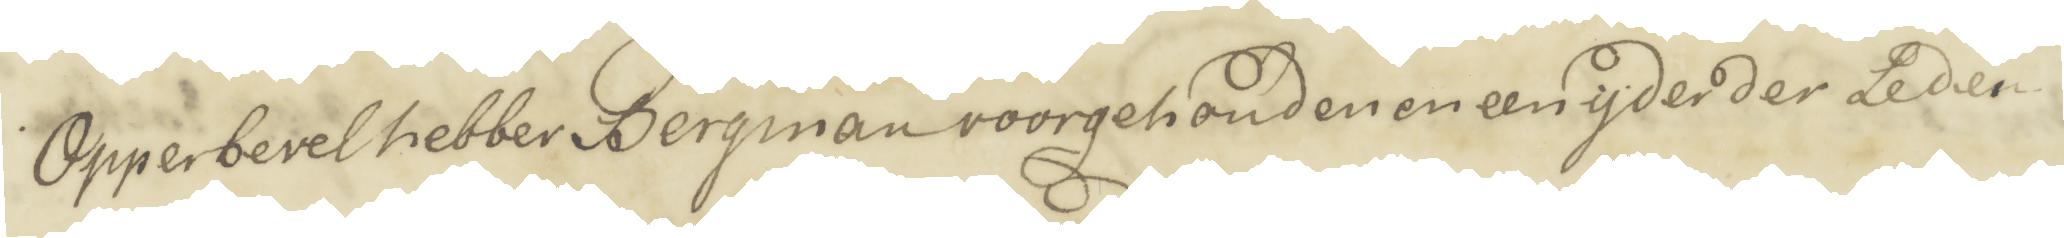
Opperbevelhebber Bergman voorgehouden en een ijder der Leden
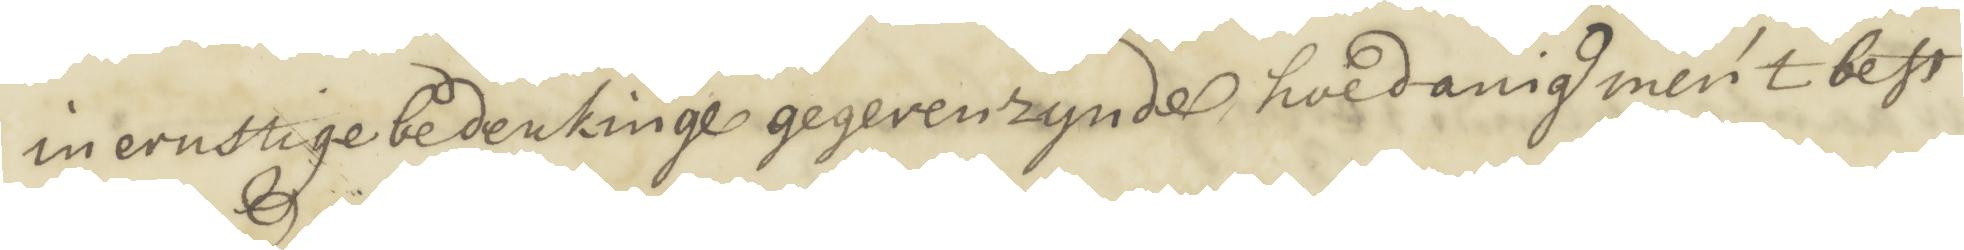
in ernstige bedenkinge gegeven zynde, hoedanig men 't best
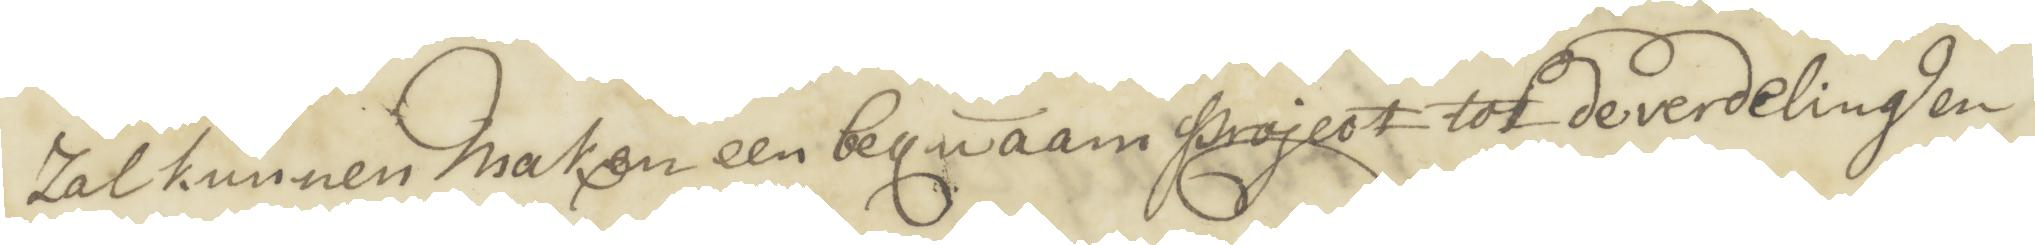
zal kunnen Maken een bequaam project tot de verdeling en
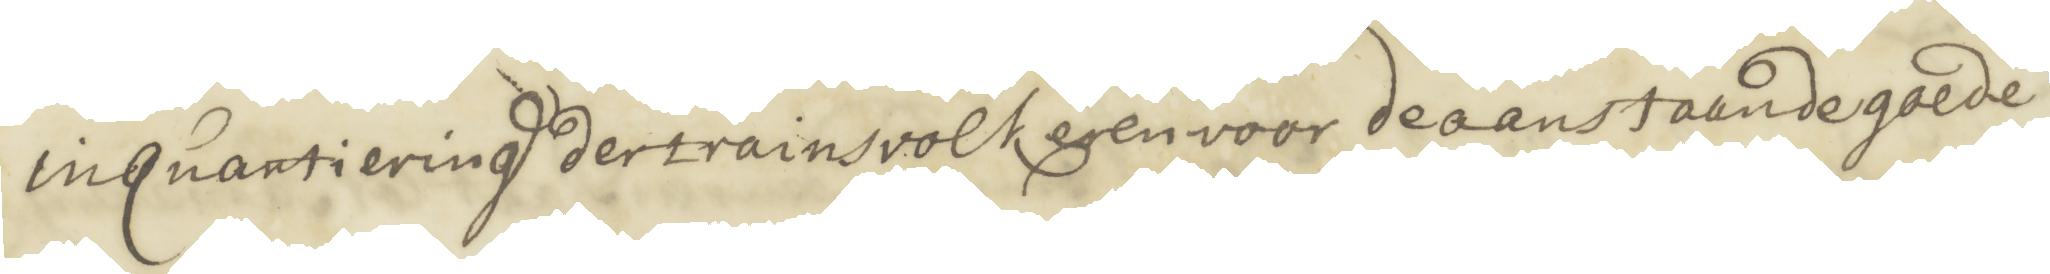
inquartiering der trains volkeren voor de aanstaande goede
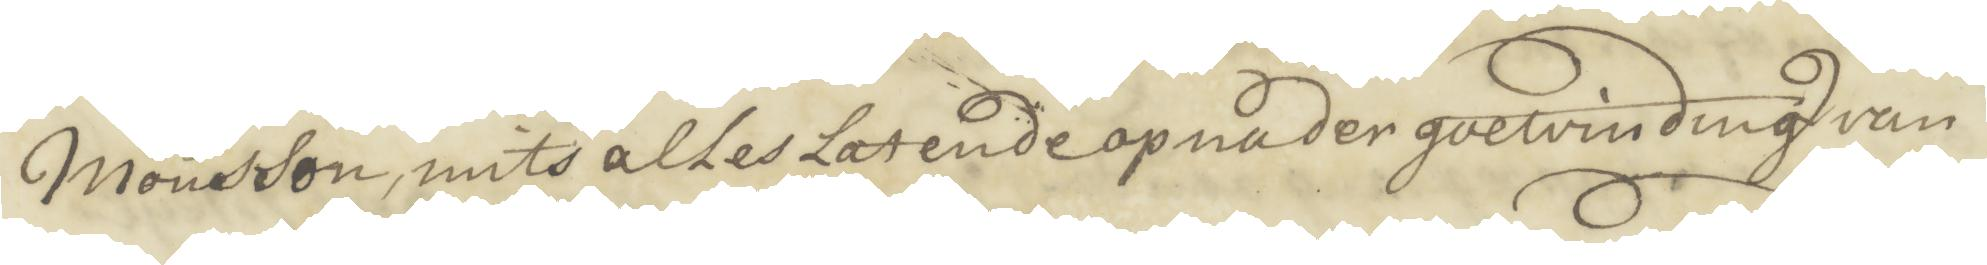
Mousson, mits alles latende op nader goetvinding van
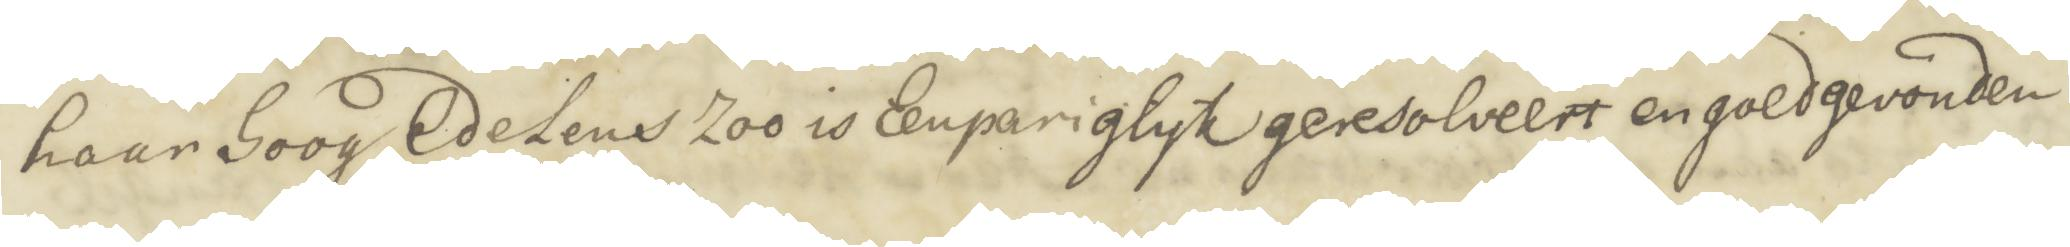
haar hoog Edelens zoo is Eenpariglijk geresolveert en goed gevonden
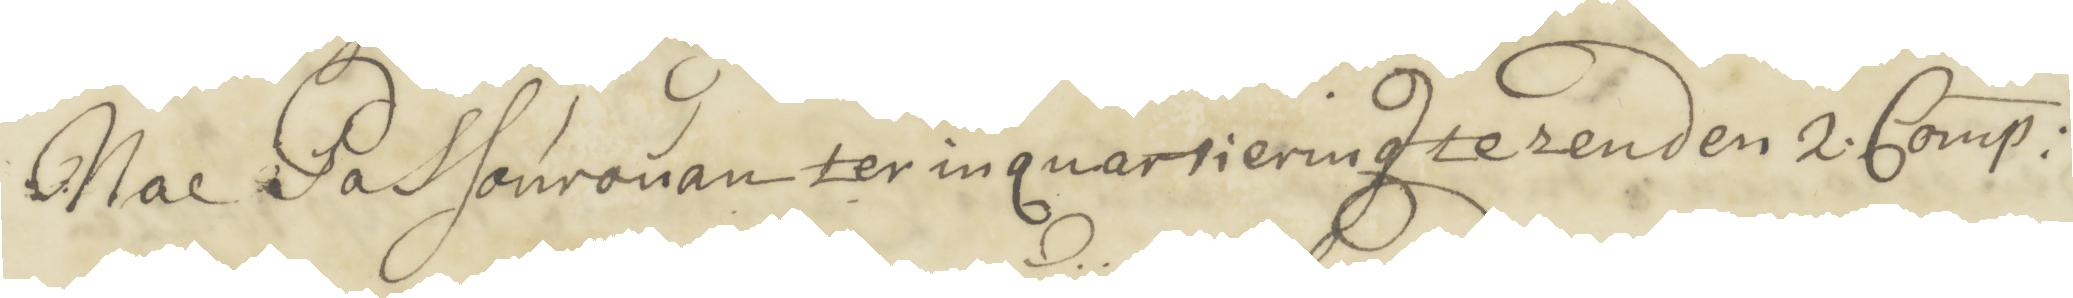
Nae Passourouan ter inquartiering te zenden 2. Comp:
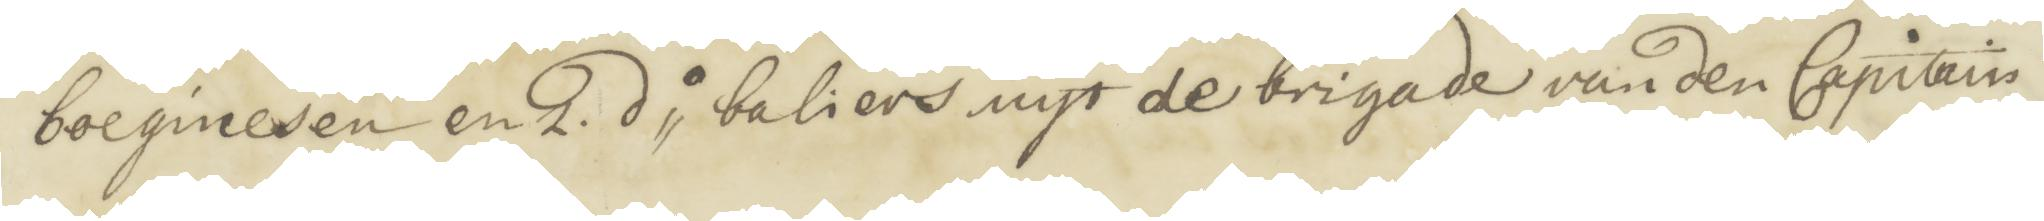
boeginesen en 2. d„o baliers uijt de brigade van den Capitain
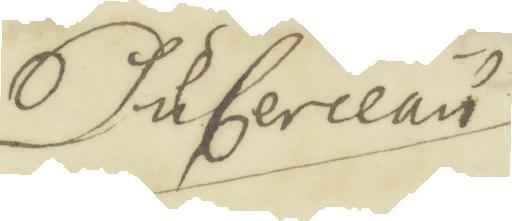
Suceriean'
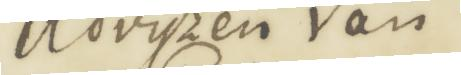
Advyzen Van
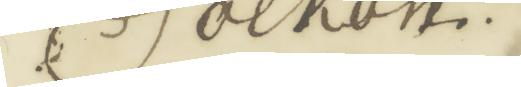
Soekan.
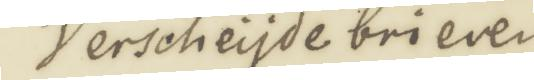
Verscheijde brieven
